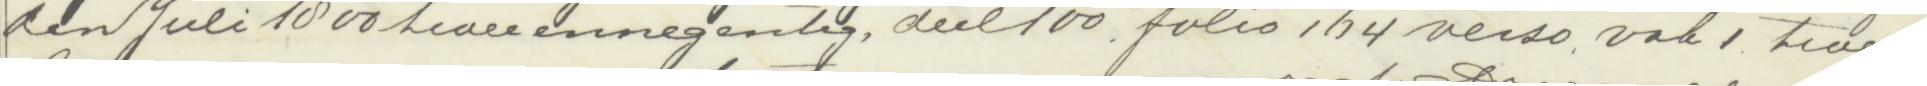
den Juli 1800 twee ennegentig, deel 100 folio 164 verso, vak 1 twee
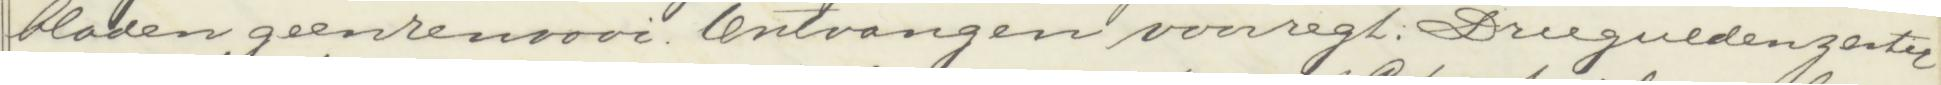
bladen, geen renvooi. Ontvangen voorregt: Drie gulden zestig
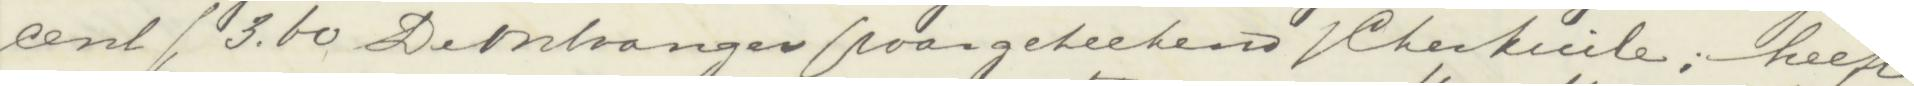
cent ƒ 3.60 De ontvanger (was geteekend / C ter Kuile; heeft
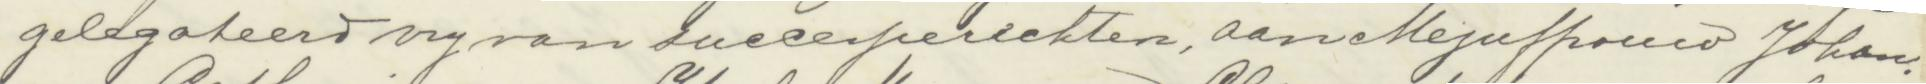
gelegateerd vry van successierichten, aan Mejuffrouw Johan.
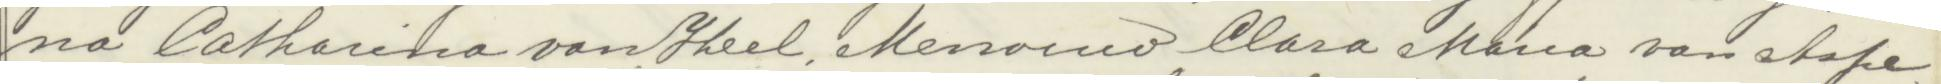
na Catharina van Heel, Mevrouw Clara Maria van Aspe.
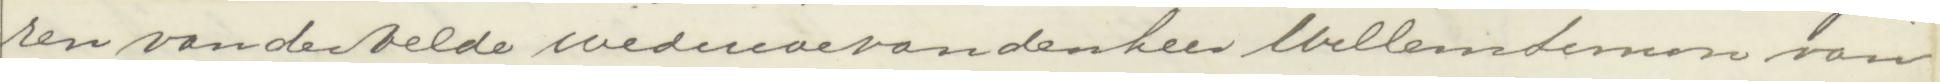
en van der Velde weduwe van den heer Willem Simon van
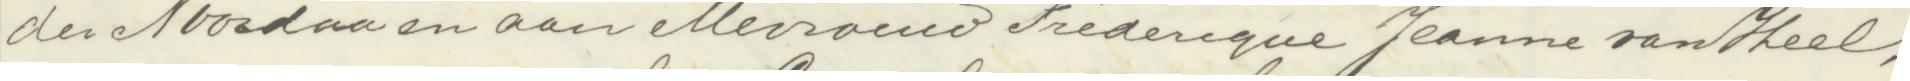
der Noordaa en aan Mevrouw Fréderique Jeanne van Heel,
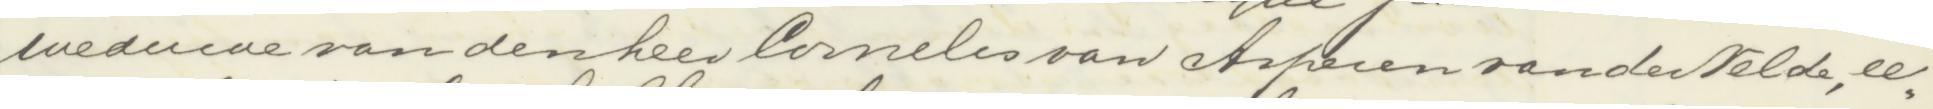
weduwe van den heer Cornelis van Asperen van der Velde, ee„
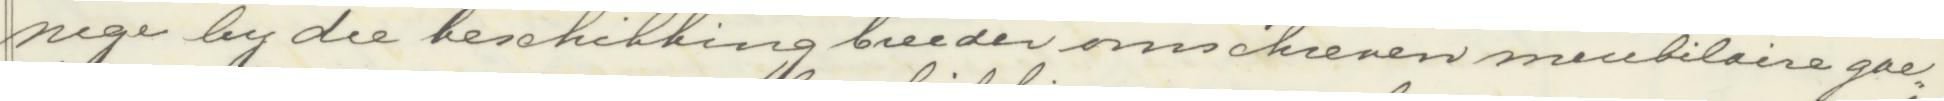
nige by die beschikking breeder omschreven meubilaire goe„
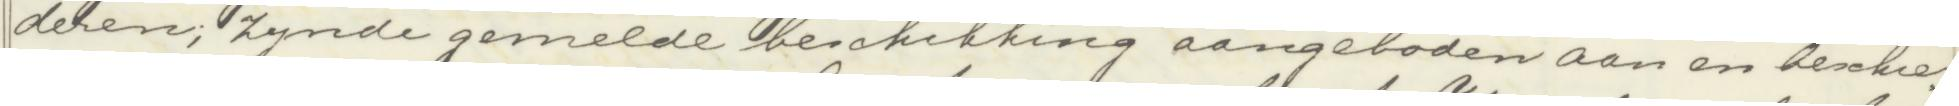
deren; zynde gemelde beschikking aangeboden aan en beschre
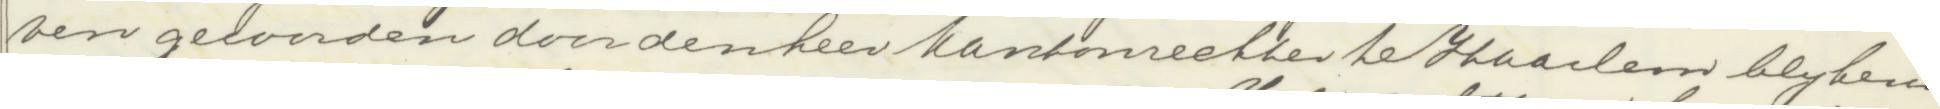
ven geworden door den heer kantonrechter te Haarlem blykens
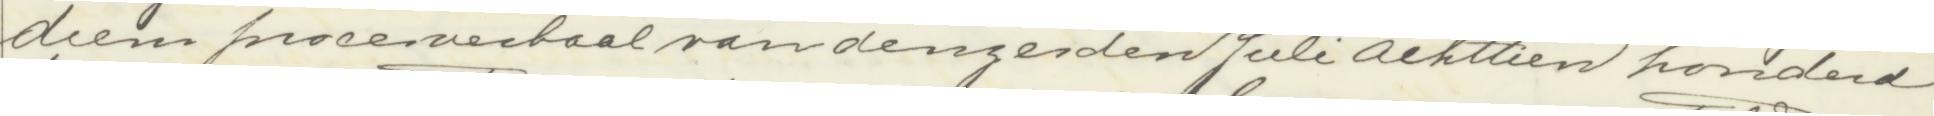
diens procesverbaal van den zesden Juli achttien honderd
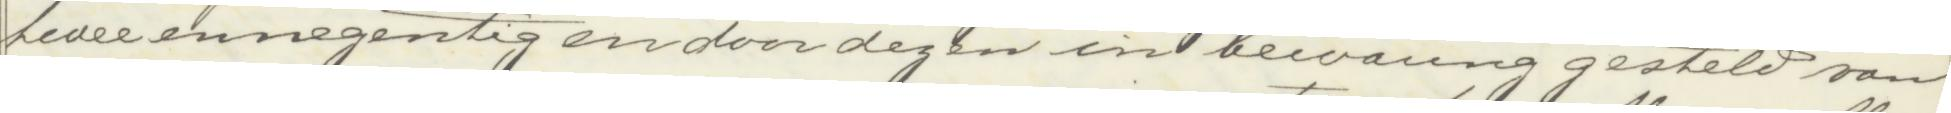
twee ennegentig en door dezen in bewaring gesteld van
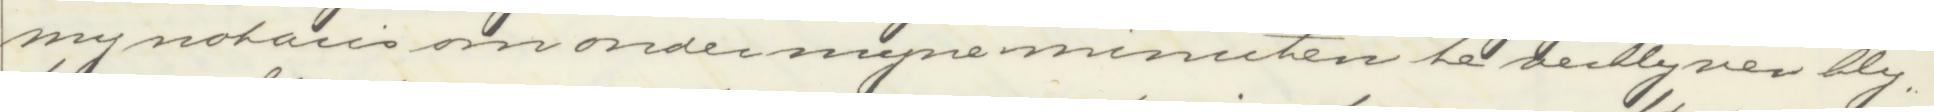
my notaris om onder myne minuten te verblyven bly„
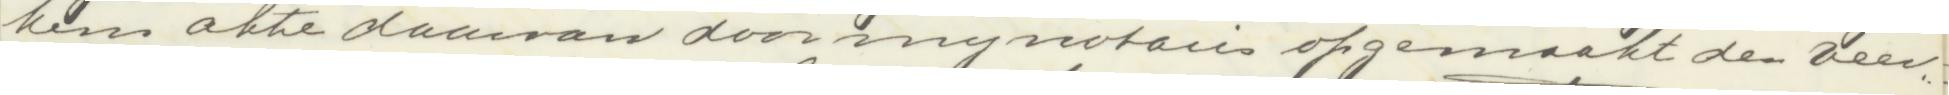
kens akte daarvan door my notaris opgemaakt den veer„
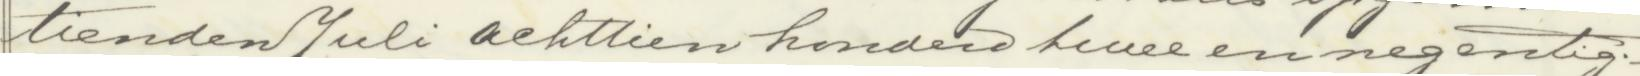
tienden Juli achttien honderd twee en negentig.
